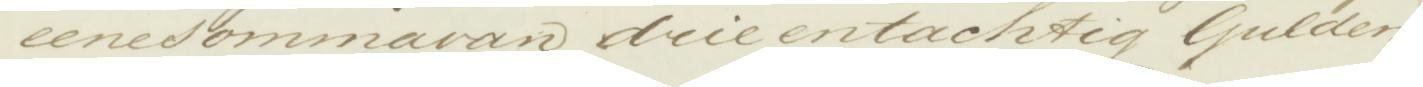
eene somma van drie en tachtig Gulden
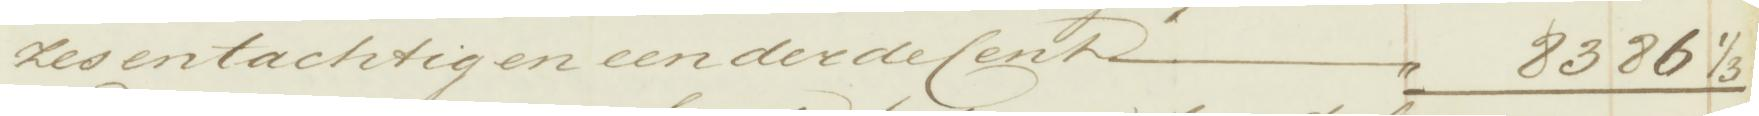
zes en tachtig en een derde Cent „ 83 86 1/3
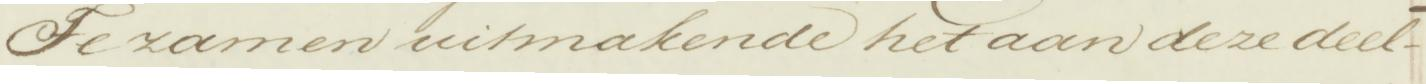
Te zamen uitmakende het aan deze deel-
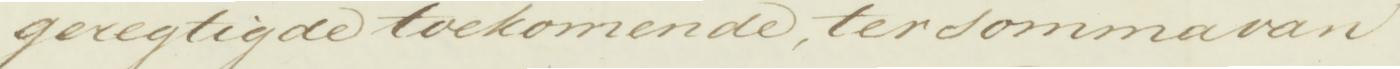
geregtigde toekomende, ter somma van
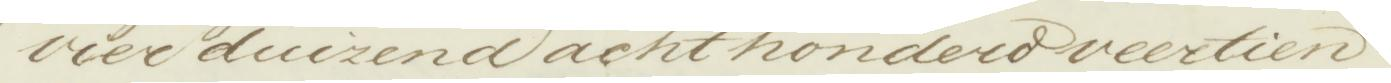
vier duizend acht honderd veertien
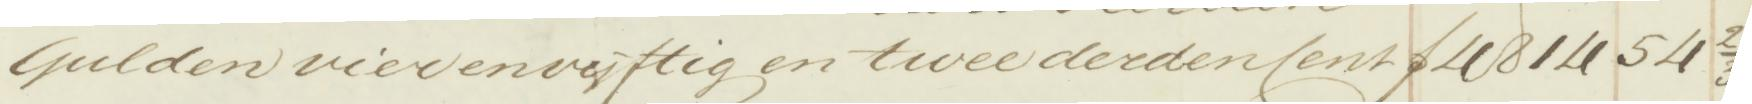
Gulden vier en vijftig en twee derden Cent ƒ4814 54 2/3
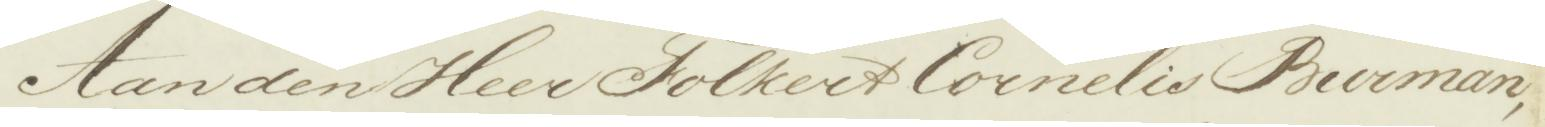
Aan den Heer Folkert Cornelis Burman,
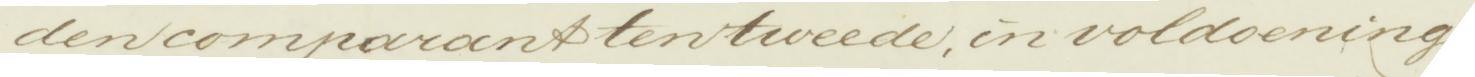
den comparant ten tweede, in voldoening
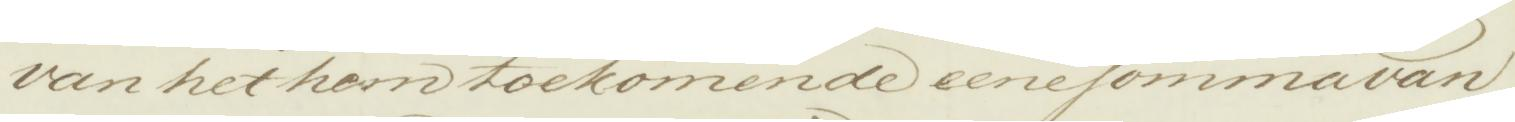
van het hem toekomende eene somma van
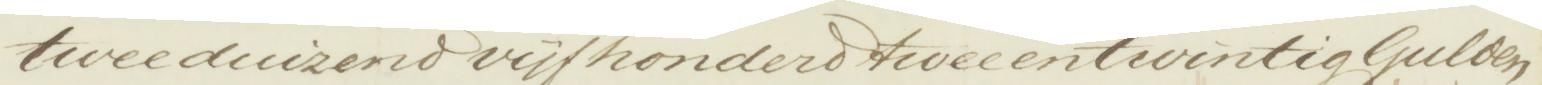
twee duizend vijf honderd twee en twintig Gulden
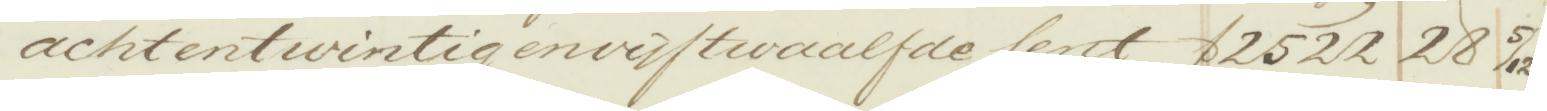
acht en twintig en vijf twaalfde Cent ƒ2522 28 5/12
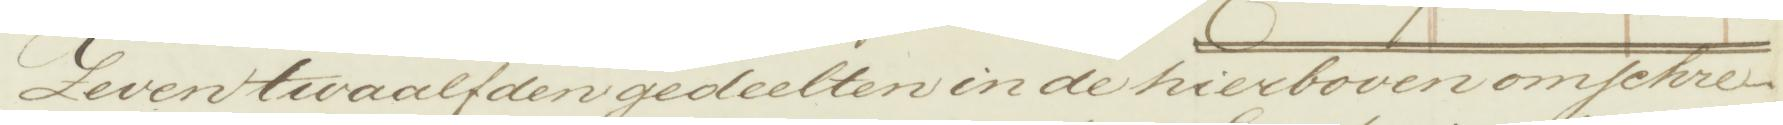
Zeven twaalfden gedeelten in de hierboven omschre-
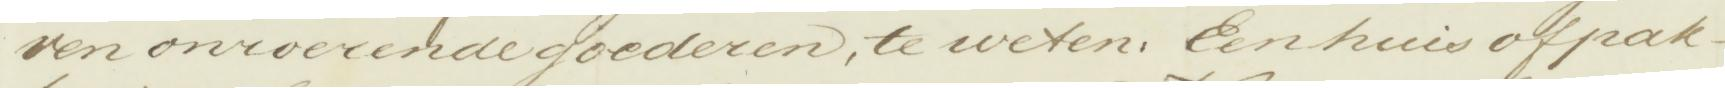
ven onroerende goederen, te weten: Een huis of pak-
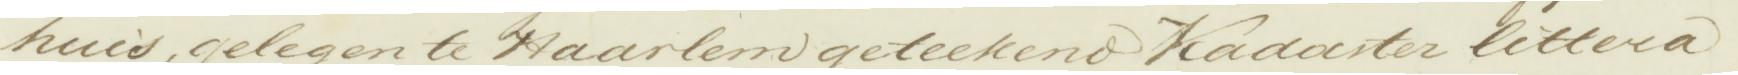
huis, gelegen te Haarlem geteekend Kadaster littera
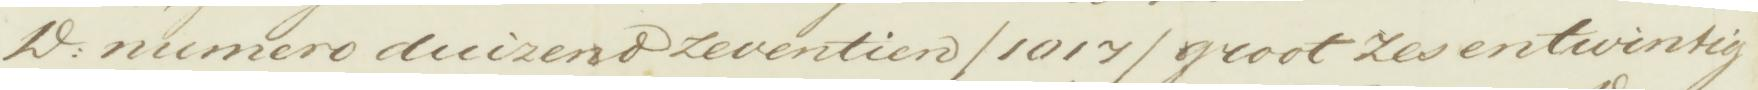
D: numero duizend zeventien /1017/ groot zes en twintig
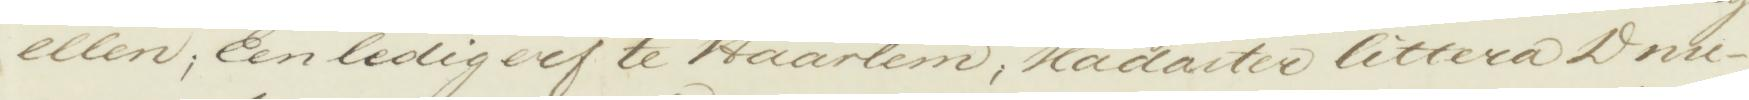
ellen; Een ledig erf te Haarlem; Kadaster littera D nu
